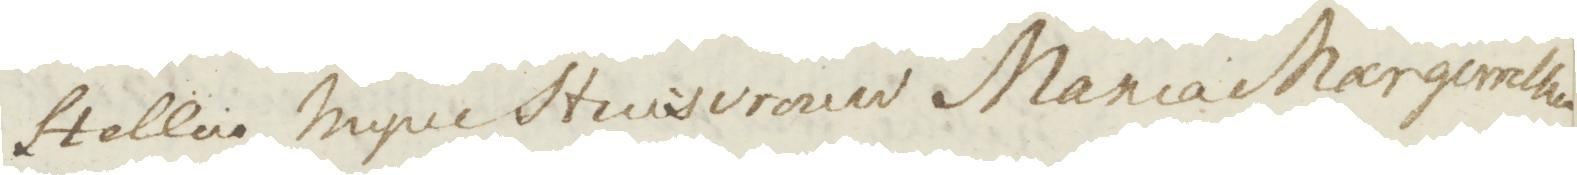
stellen myne Huisvrouw Maria Margeretha
